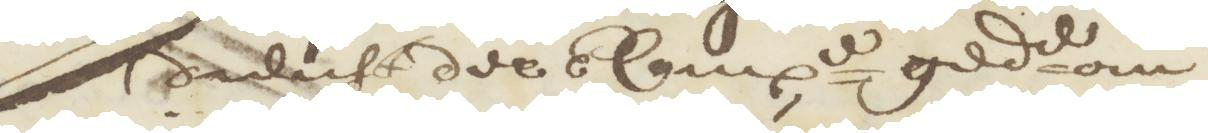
dienst der E Comp=e ged=e om
